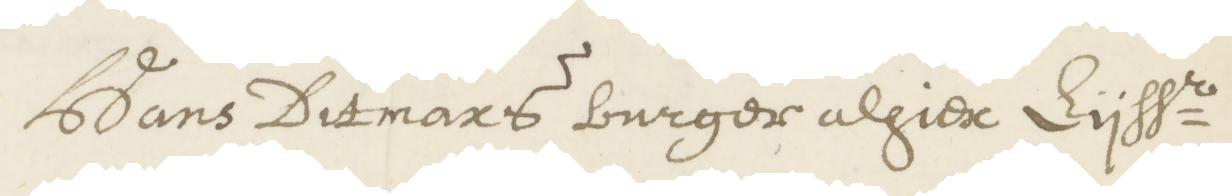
Hans Ditmars burger alhier Eijss=r
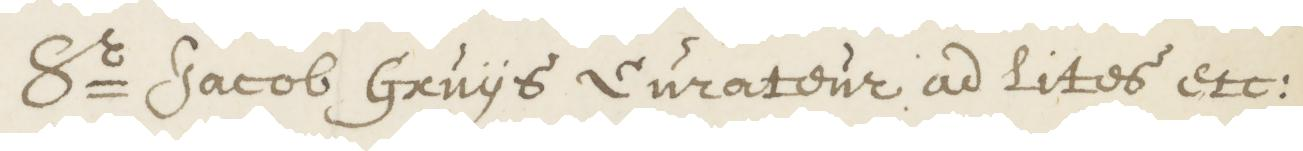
S=r Jacob Gruijs Curateur ad lites etc:
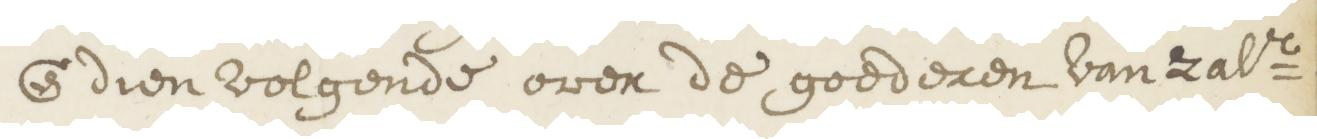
enden dien volgende over de goederen van zal=r
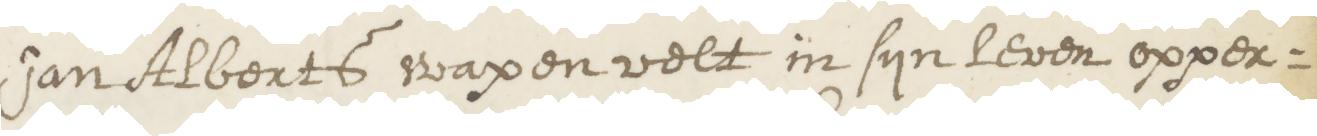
Jan Alberts wapenvelt in sijn leven opper=
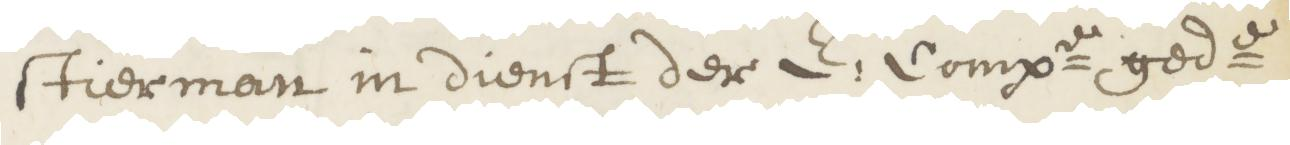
stierman in dienst der E: Comp=e ged=e
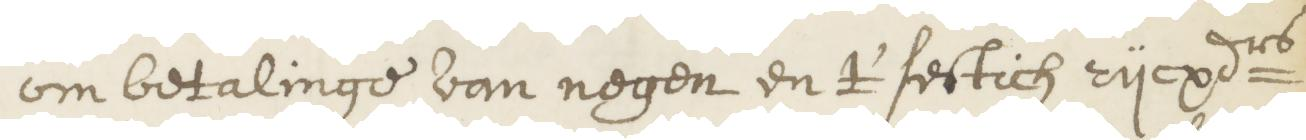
om betalinge van negen en t' sestich rijcxd=rs
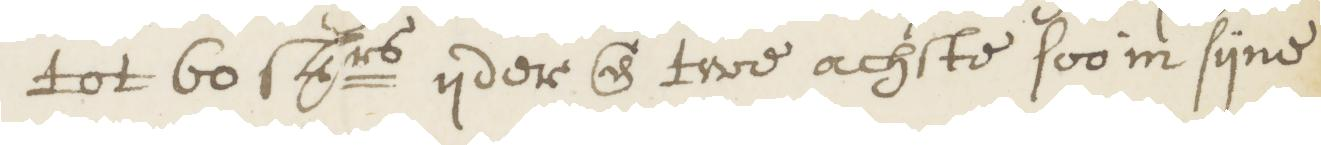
tot 60 stver=rs yder ende twe achste soo in sijne
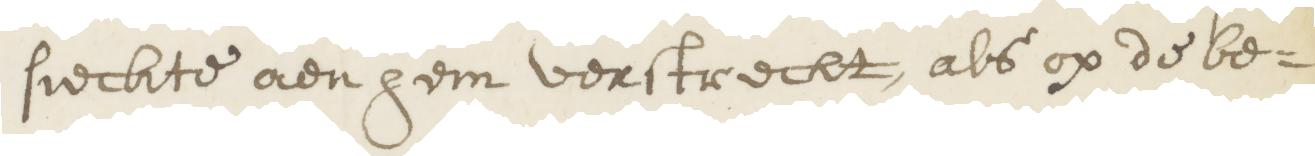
sieckte aen hem verstreckt, als op de be=
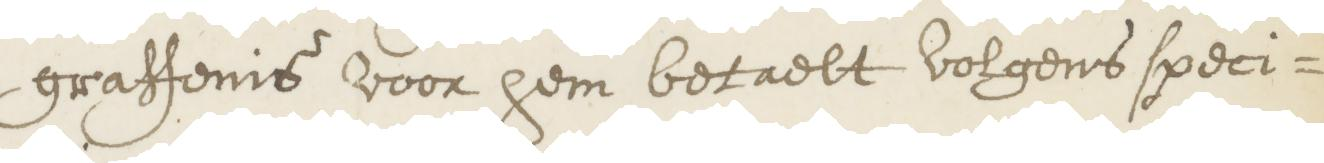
graffenis voor hem betaelt volgens speci=
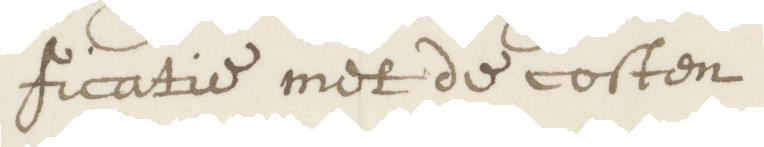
ficatie met de costen
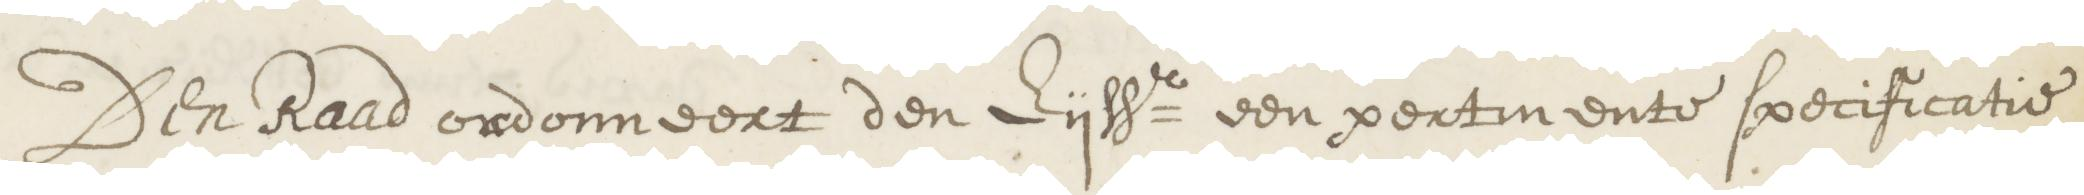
Den Raad ordonneert den Eijss=r een pertinente specificatie
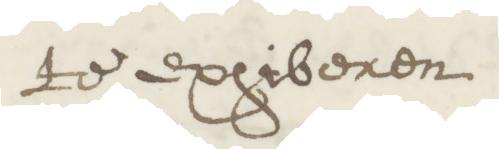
te exhiberen
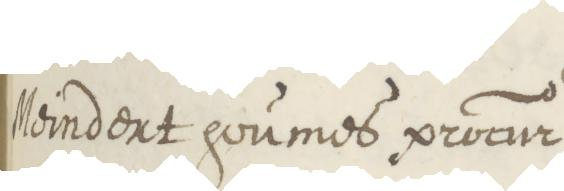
Meindert houmes procur
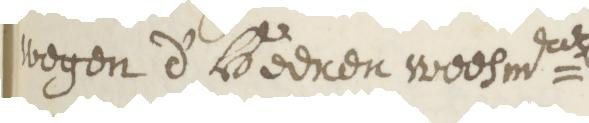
wegen d’ heeren weesm=en
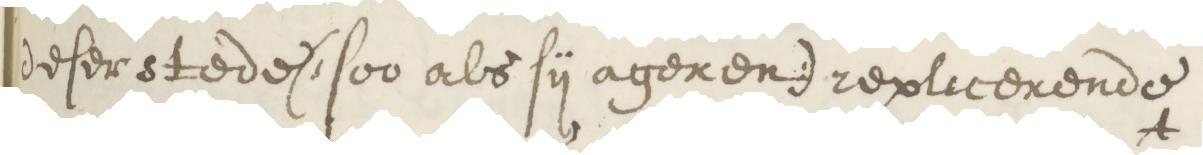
deser stede (:soo als sij agerene:) replicerende
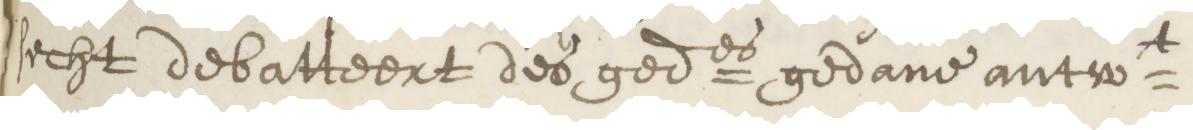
secht debatteert des ged=es gedane antw=t
